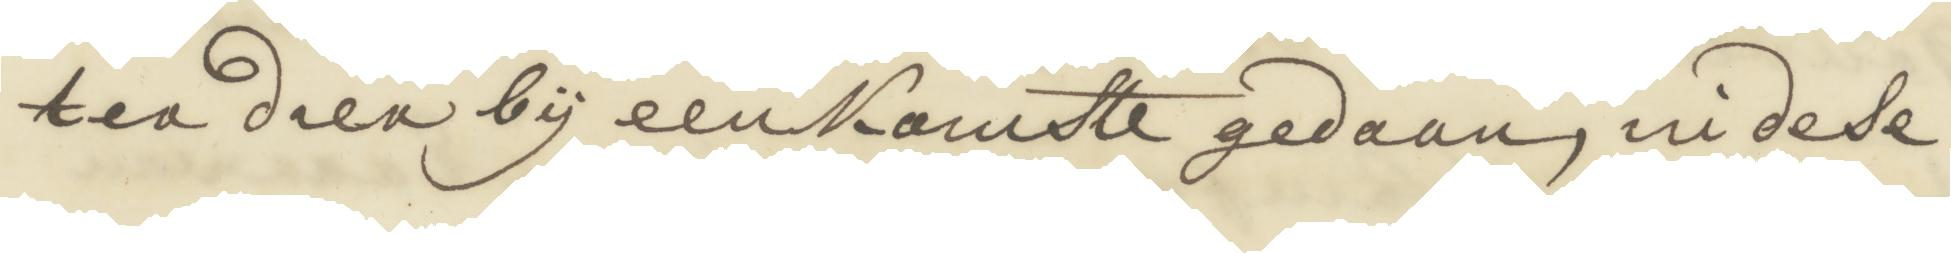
ter dier bij eenkomste gedaan, in dese
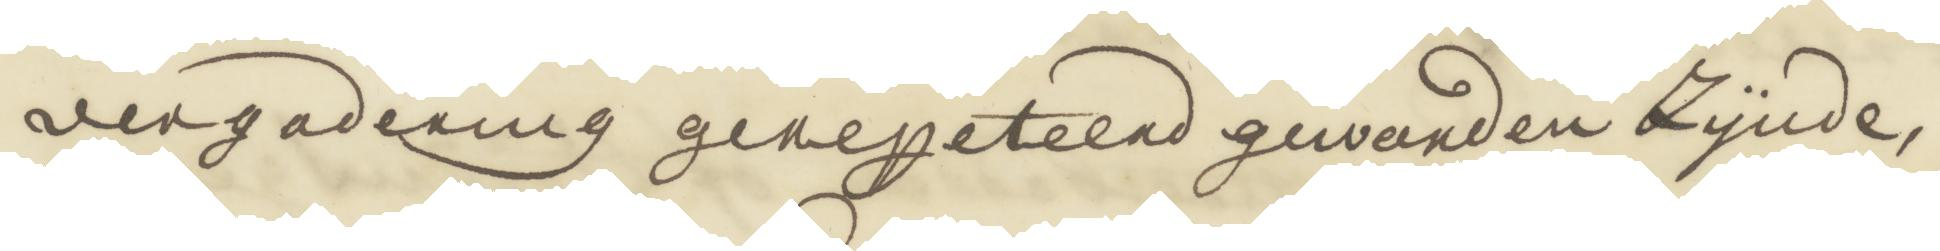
vergadering gerepeteerd gewerden Zijnde,
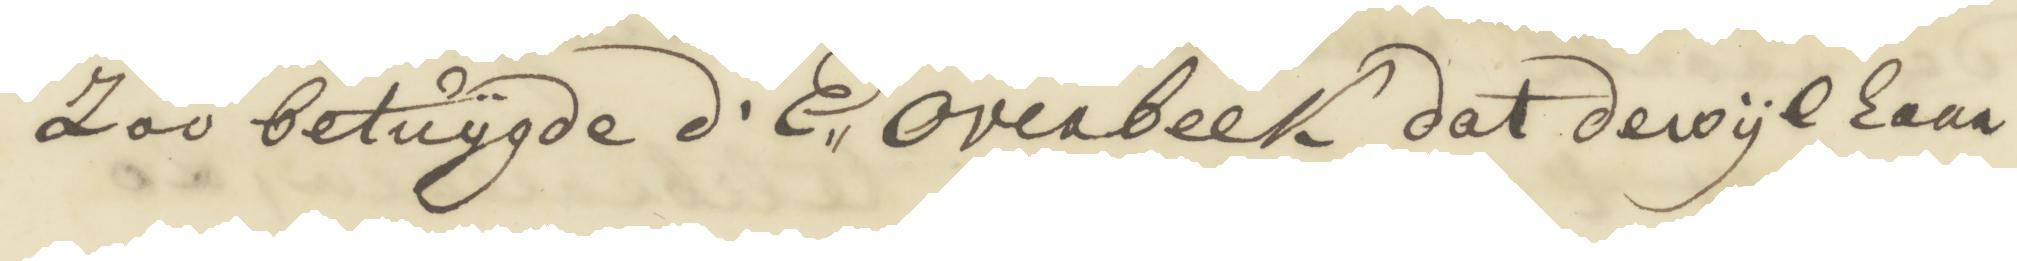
Zoo betuijgde d’ E„ Overbeek dat dewijl haar
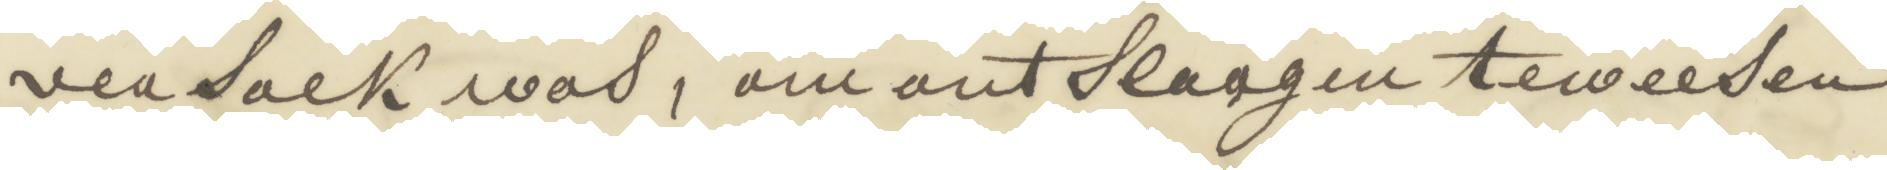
versoek was, om ontslaagen teweesen
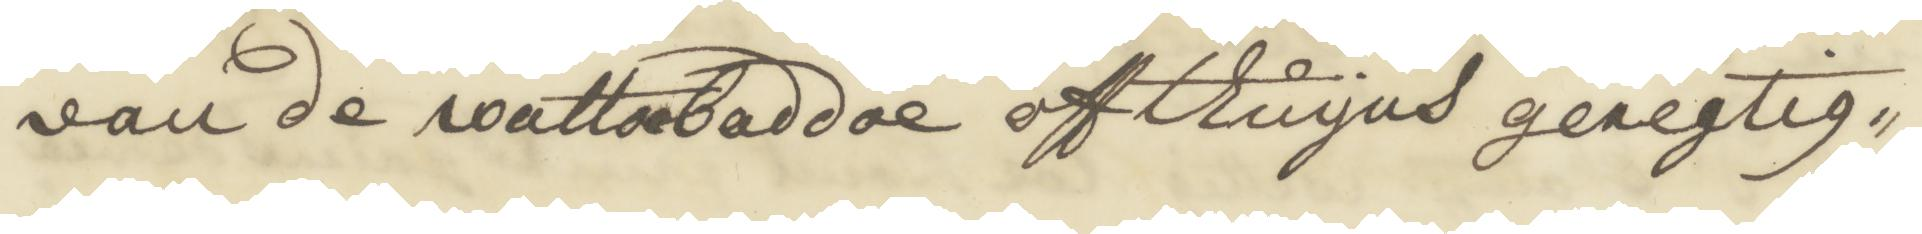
van de wattobaddoe off thuijns geregtig„
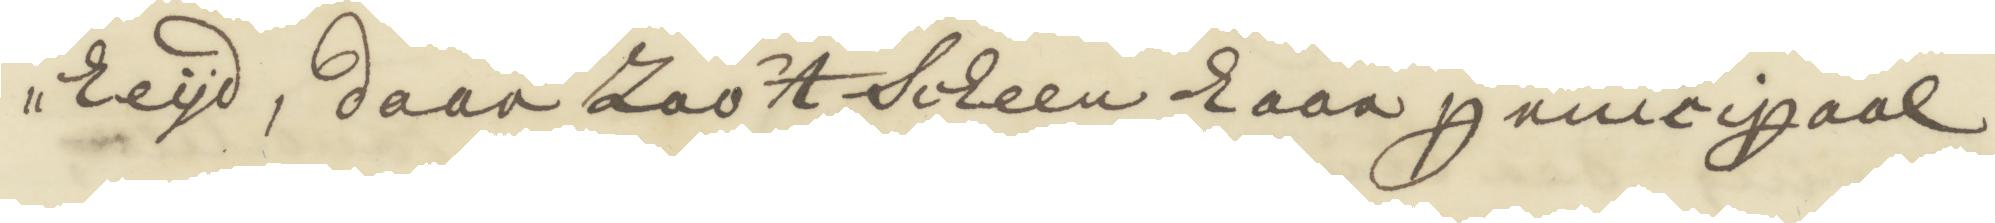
„heijd, daar Zoo ’t scheen haar principaal
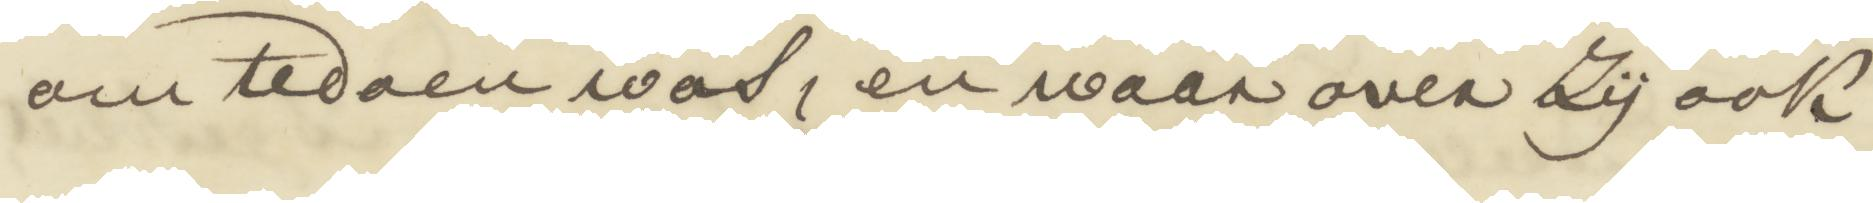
om te doen was, en waar over Zij ook
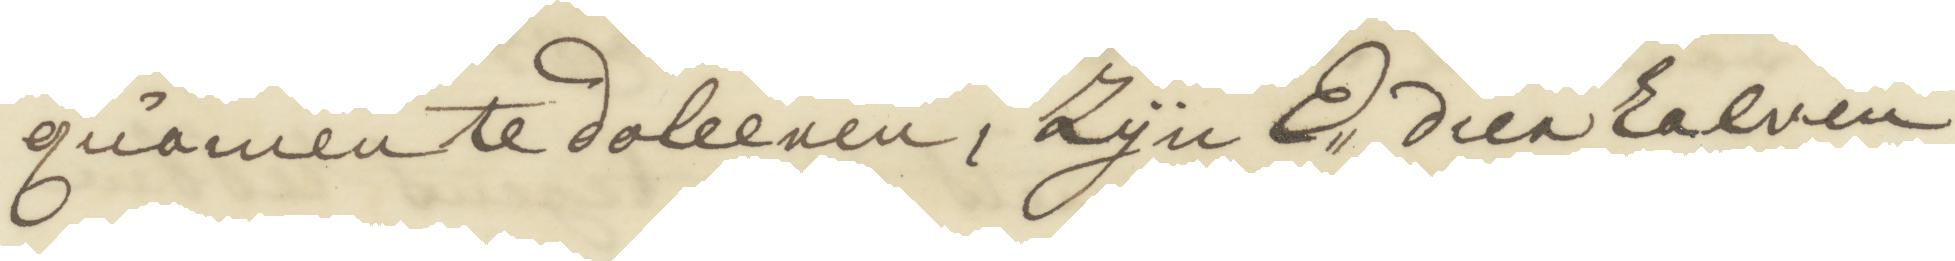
quamen te doleeren, Zijn E„ dierhalven
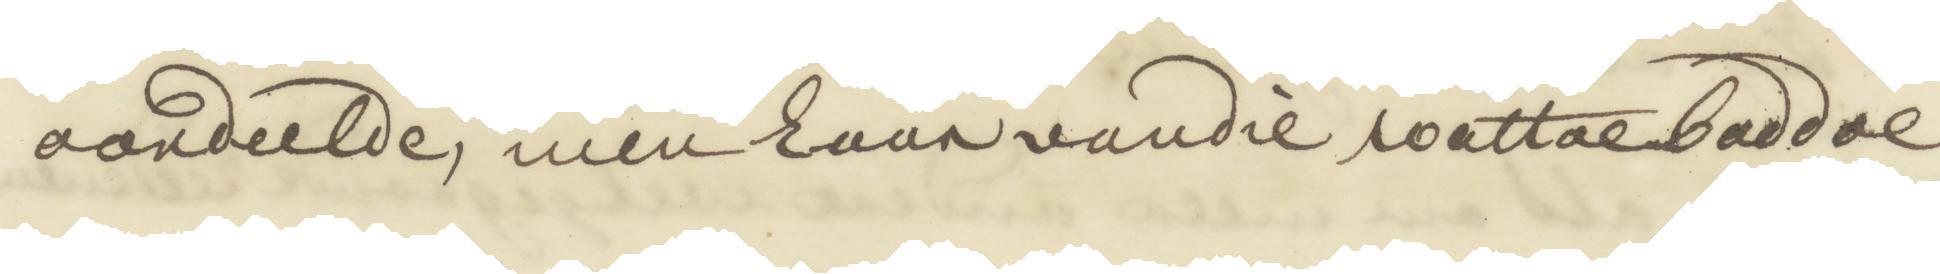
oordeelde, men haar van die wattoebaddoe
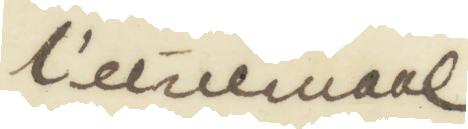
t' eenemaal
